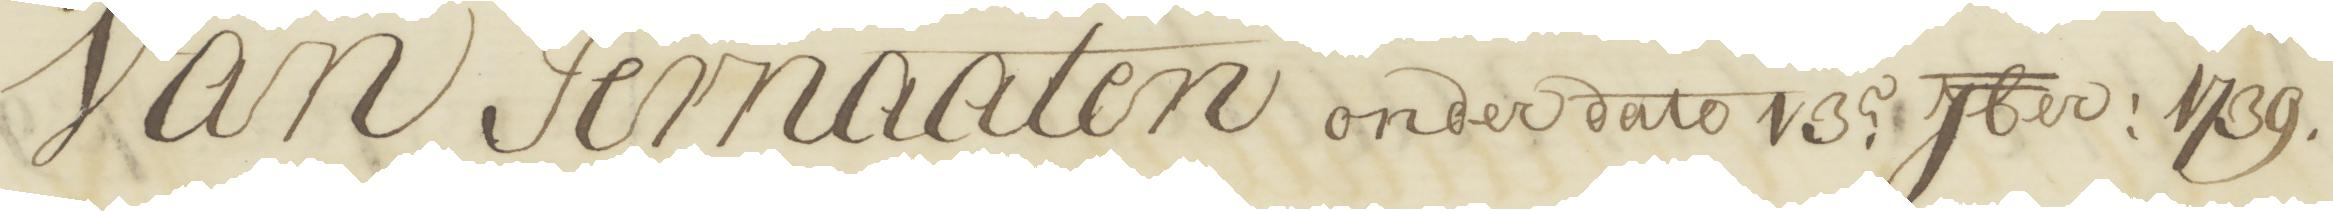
Van Ternaaten onder dato 13„' 7ber: 1739.
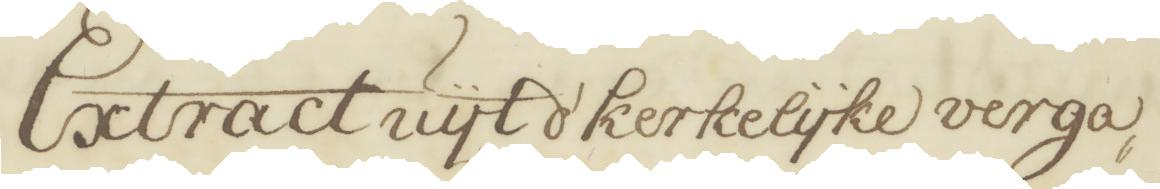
Extract uijt d'kerkelijke verga„
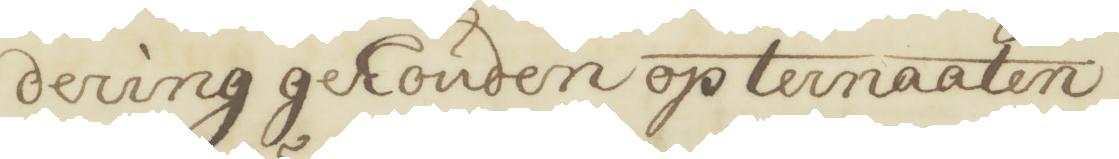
dering gehouden op ternaaten
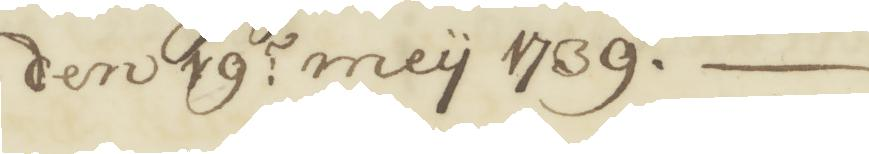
den 19:' meij 1739. —
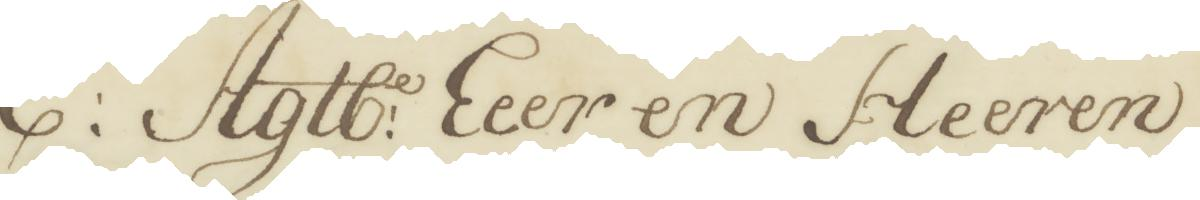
E: Agtb:e heer en Heeren
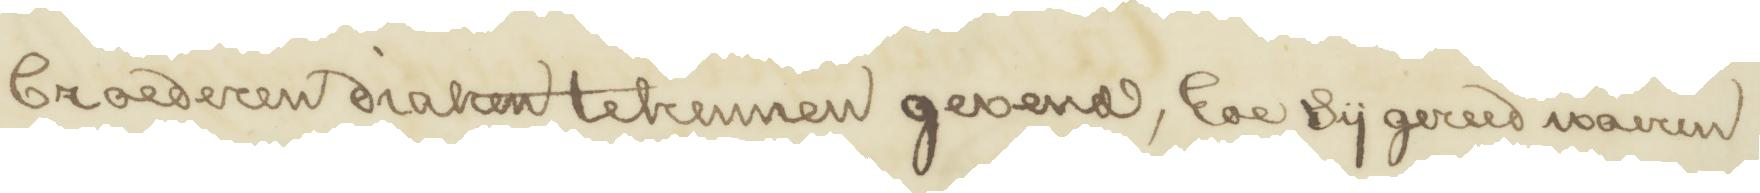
broederen draken tekennen gevende, hoe sij gereed waeren
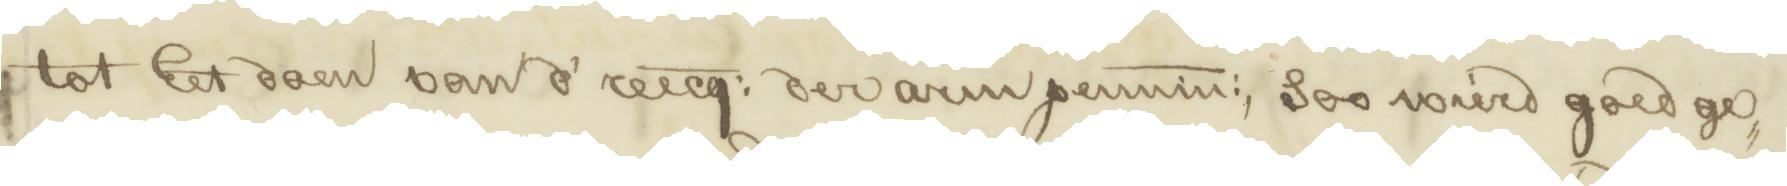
tot het doen van d’ reecq: der arm pennin:, soo wierd goed ge„
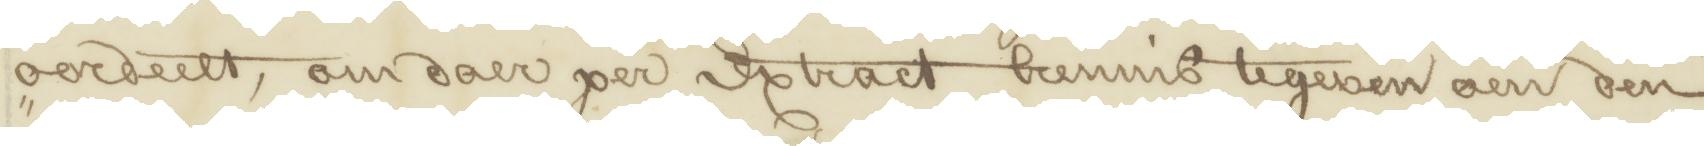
„oordeelt, om daer per Extract kennis te geven aen den
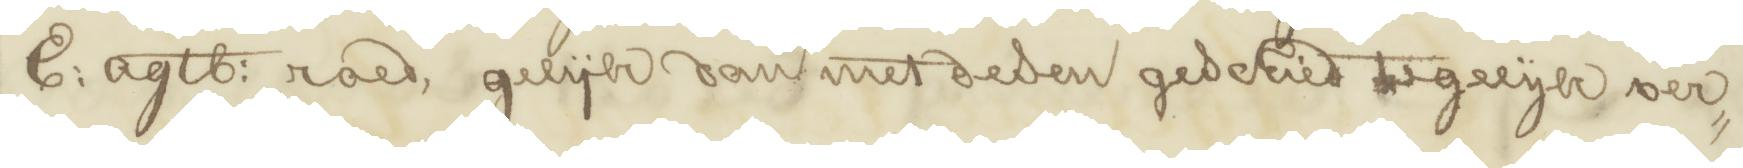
E: agtb: raed, gelijk dan met desen geschied tegelijk ver„
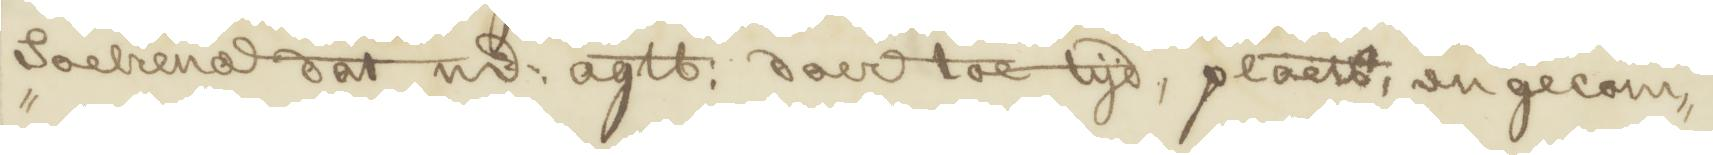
„soekende dat uE: agtb: daer toe tijd, plaets, en gecom„
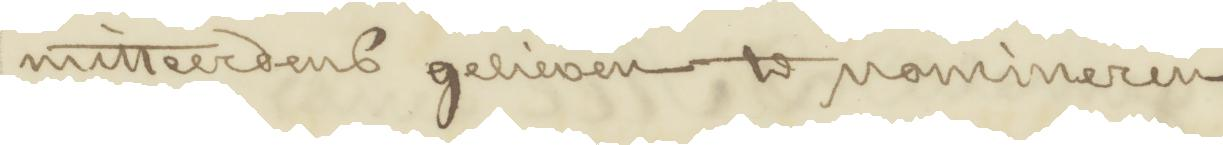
mitteerdens gelieven te nomineren
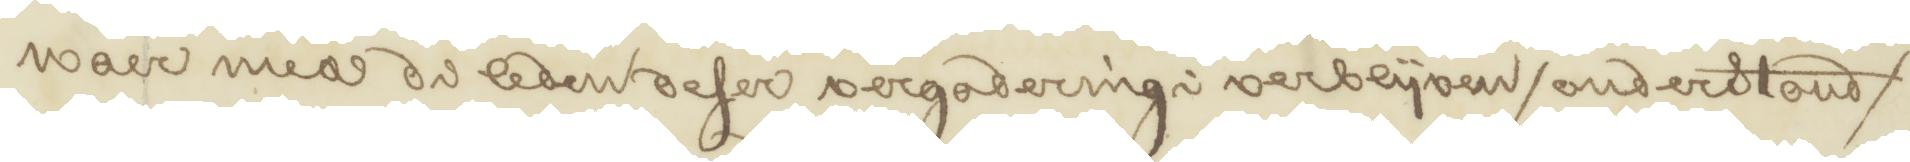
waer mede de leden deser vergaderinge verblijven /onderstond/
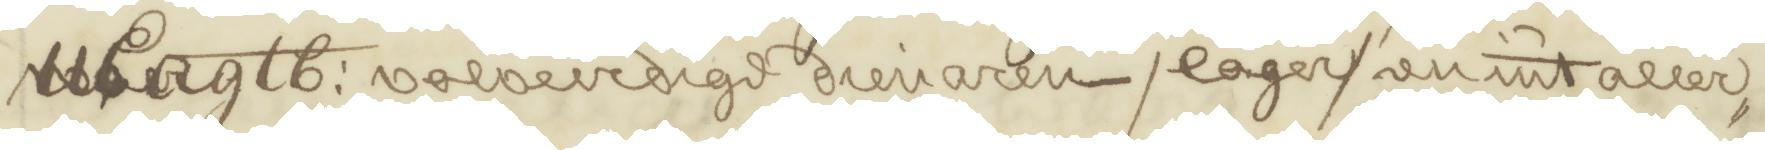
UE agtb: volveerdige dienaren / lager/ en in't aller„
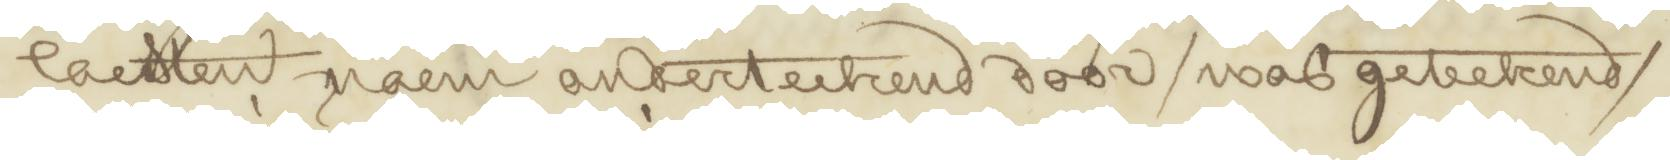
laesten naem onderteekend door /was geteekend/
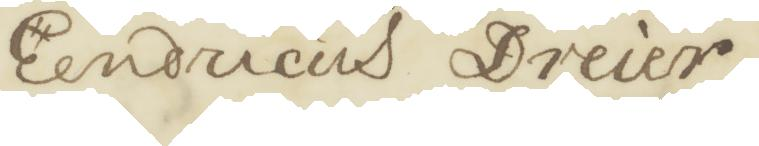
hendricus Dreier
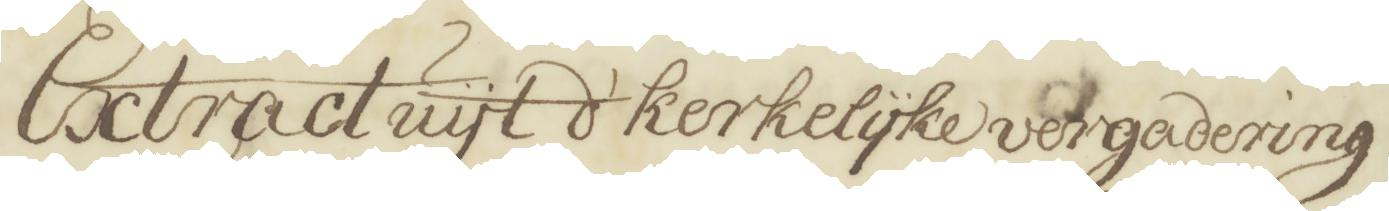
Extract uijt d’kerkelijke vergadering
